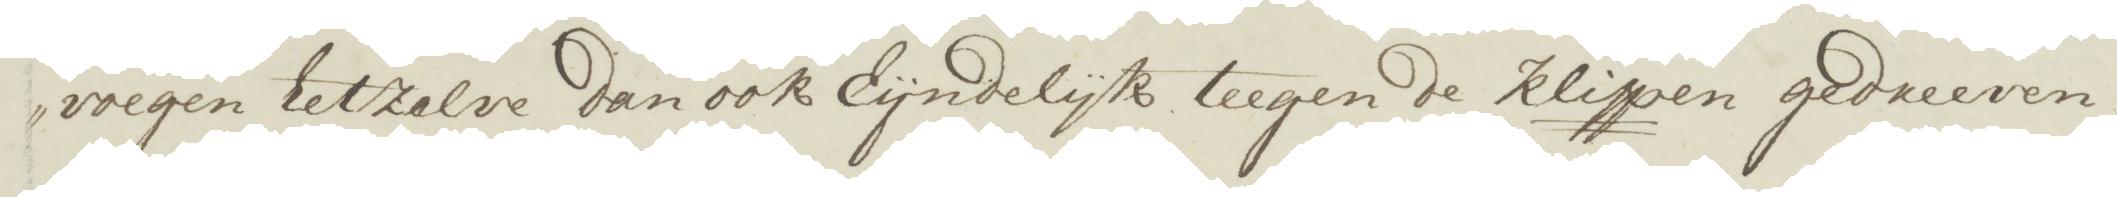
„voegen hetzelve dan ook Eijndelijk teegen de klippen gedreeven
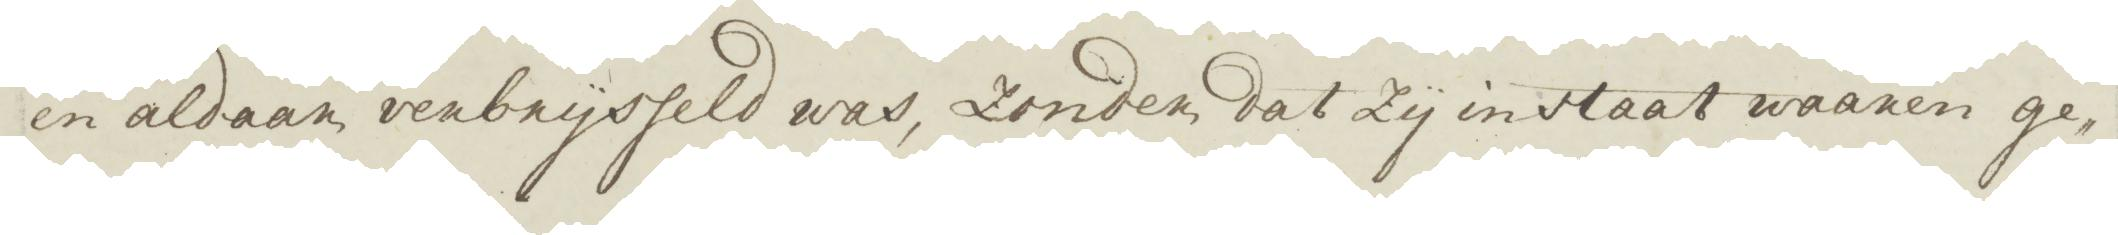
en aldaar verbrijsseld was, zonder dat zij in staat waaren ge„
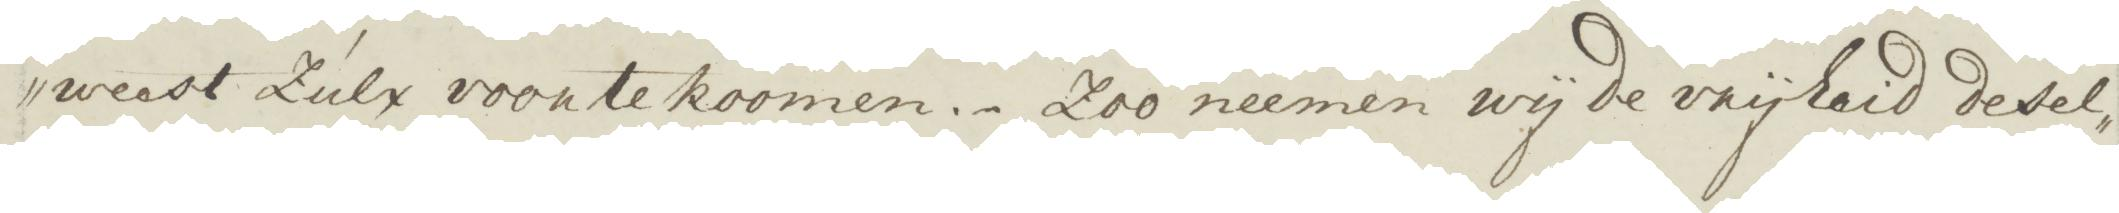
„weest zulx voor te koomen. — zoo neemen wij de vrijheid desel„
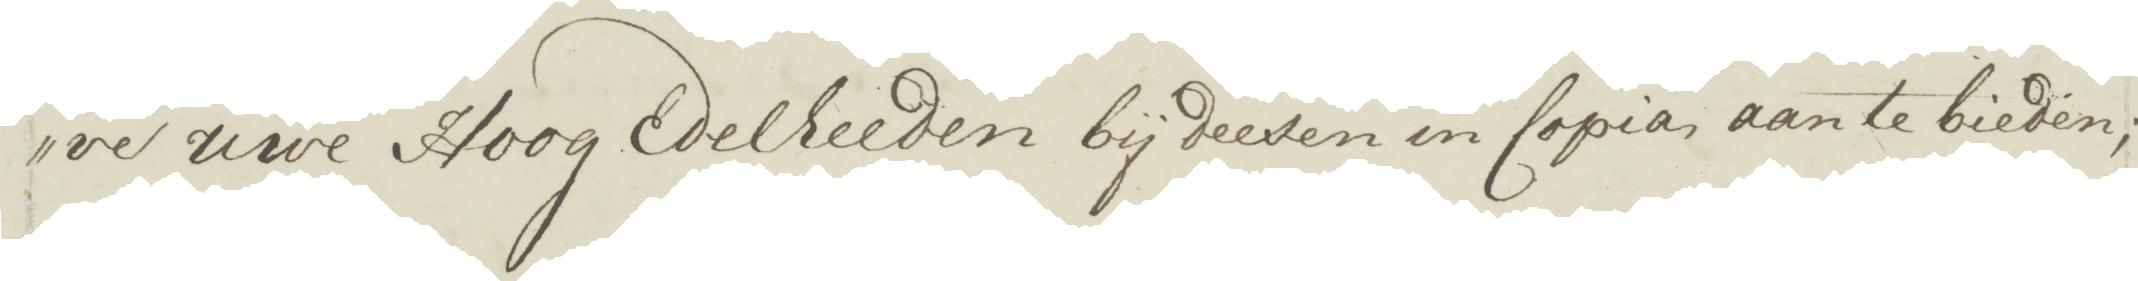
„ve uwe Hoog Edelheeden bij deesen in Copia aan te bieden;
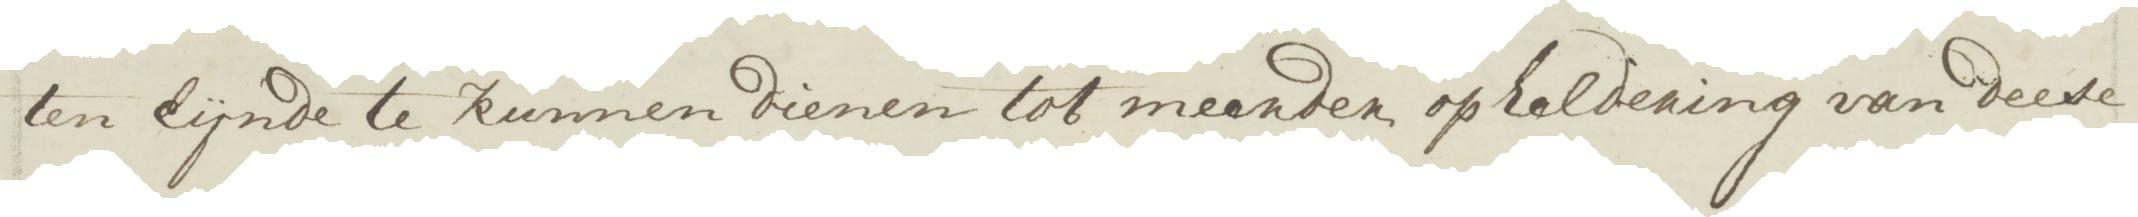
ten Eijnde te kunnen dienen tot meerder op heldering van deese
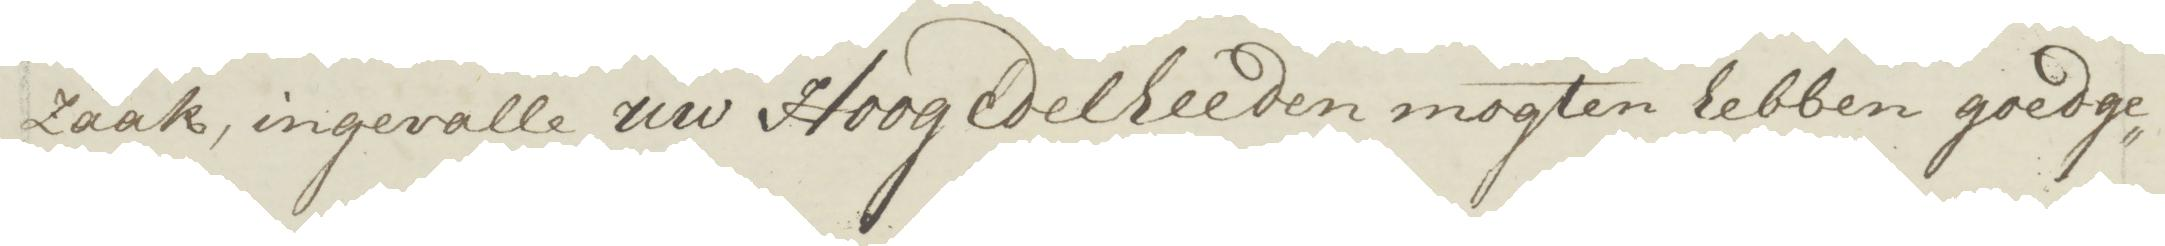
zaak, ingevalle uw Hoog Edelheeden mogten hebben goedge„
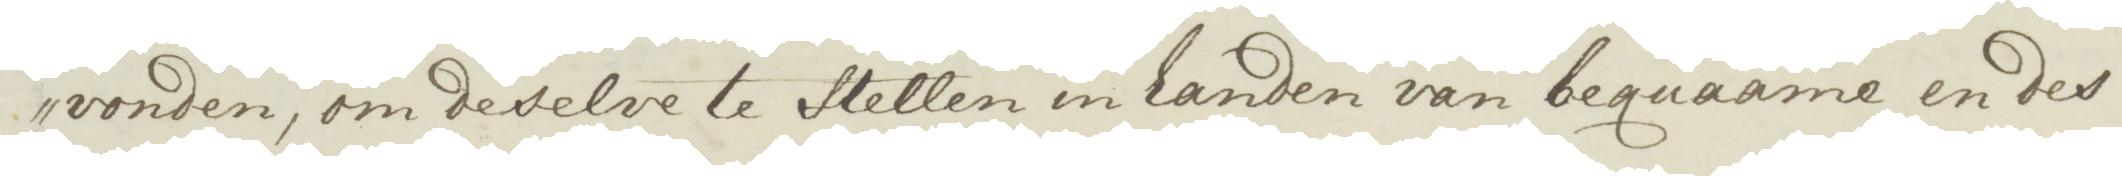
„vonden, om deselve te stellen in handen van bequaame en des
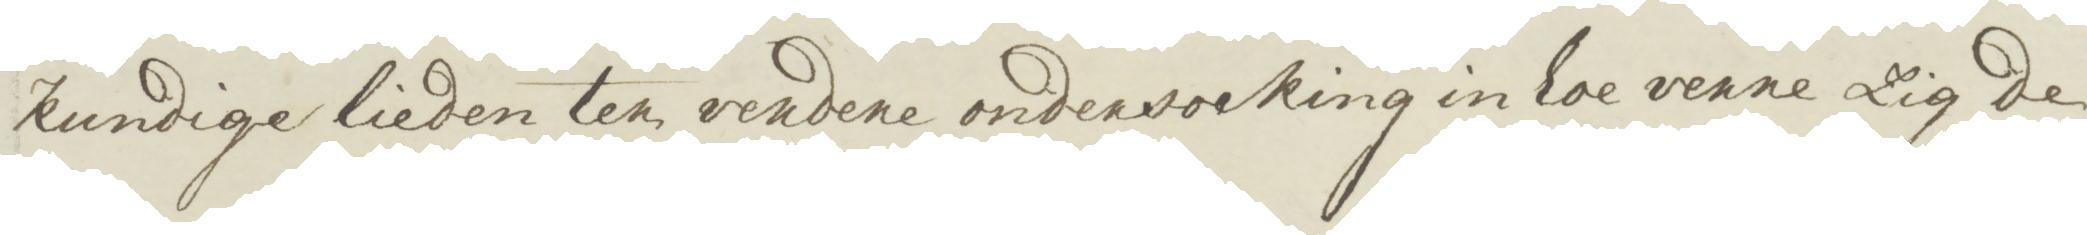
kundige lieden ter verdere ondersoeking in hoe verre zig de
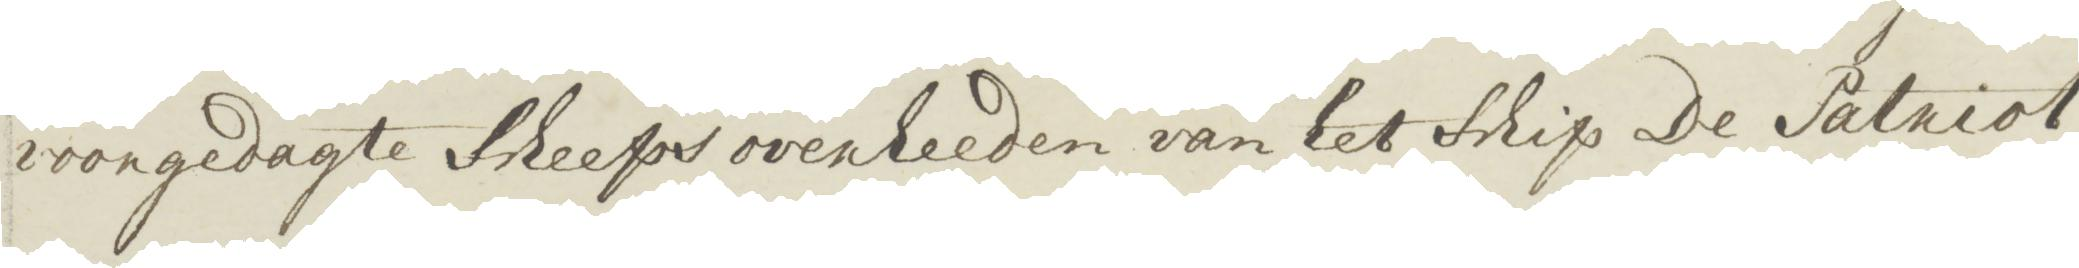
voorgedagte scheeps overheeden van het schip De Patriot,
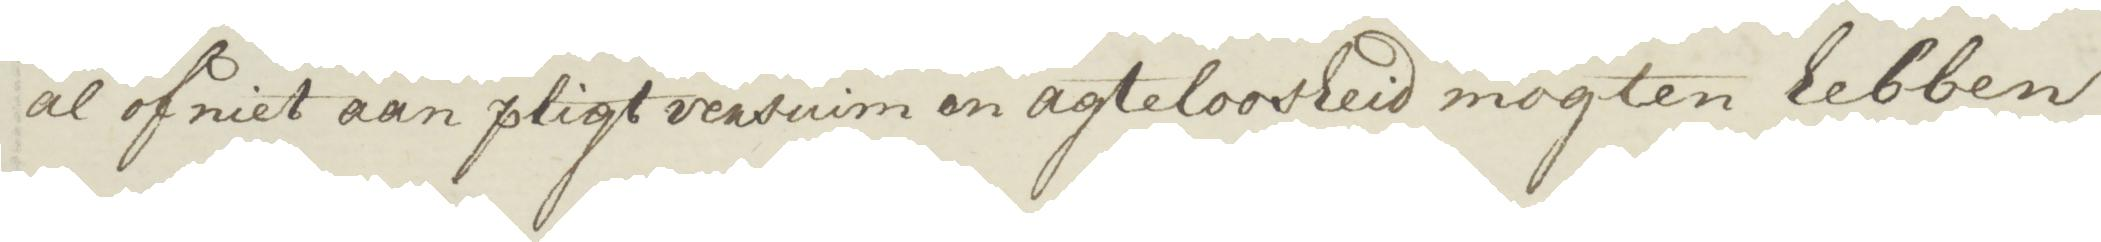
al of niet aan pligt versuim en agteloosheid mogten hebben
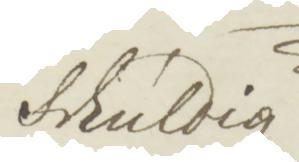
schuldig
